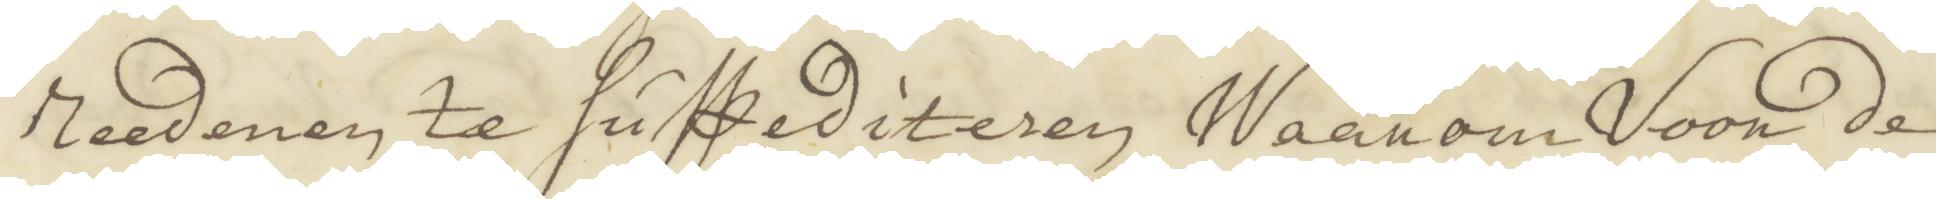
reedenen te suppediteren waarom voor de
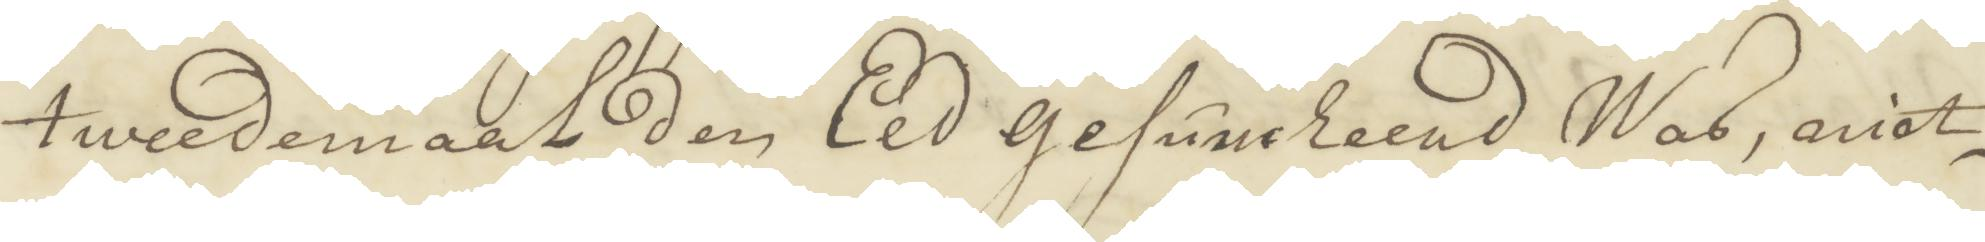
tweedemaal den Eed gesurcheerd was, niet
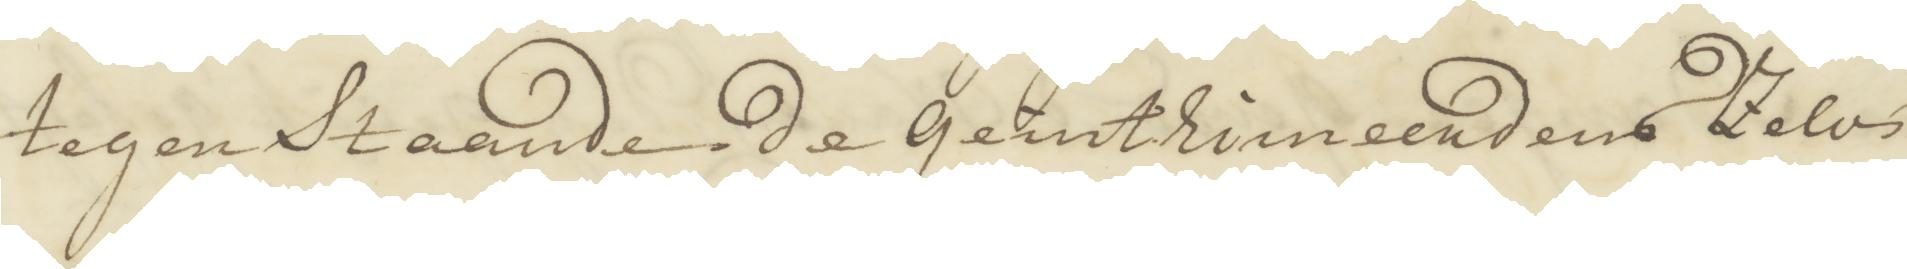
tegenstaande de geinthimeerdens zelvs
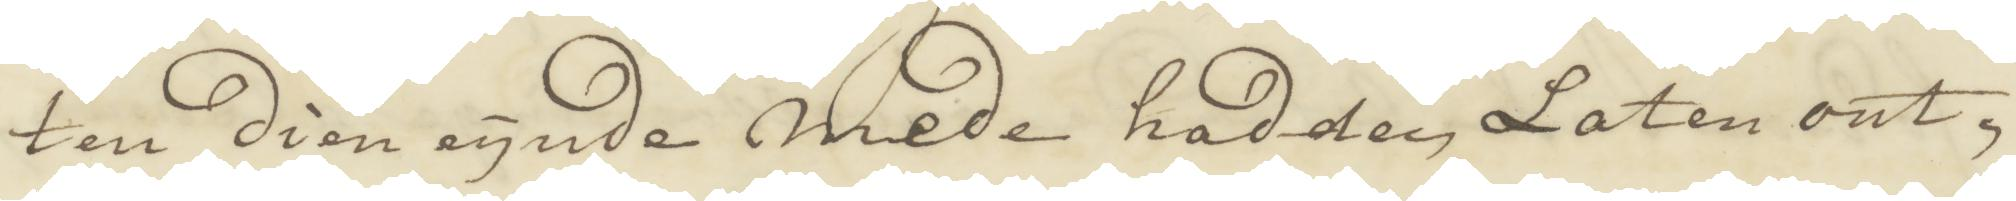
ten dien eijnde mede hadden Laten ont„
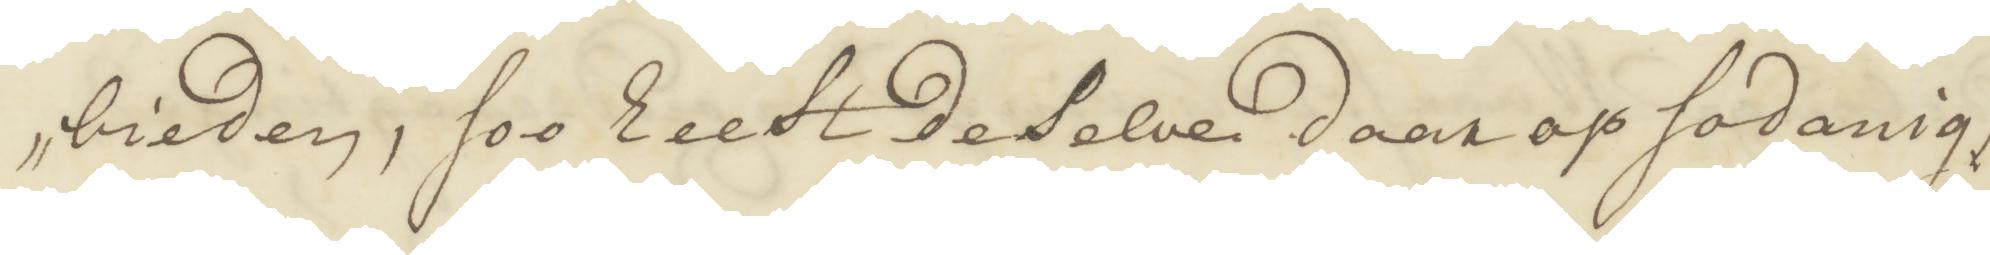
„bieden, soo reest deselve daar op sodanig,
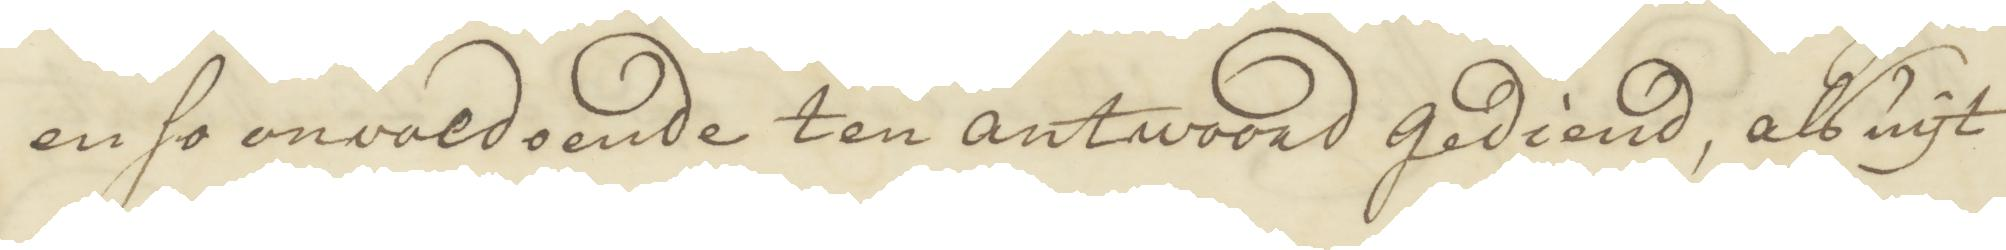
en so onvoldoende ten antwoord gediend, als uijt
